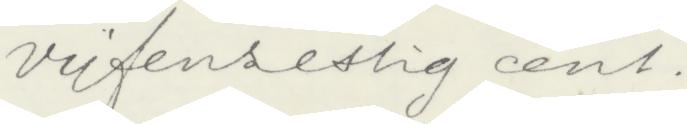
vijfenzestig cent.
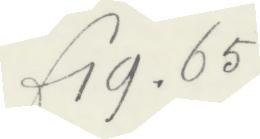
ƒ19.65
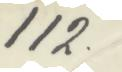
112.
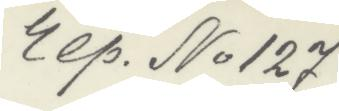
Rep. No127
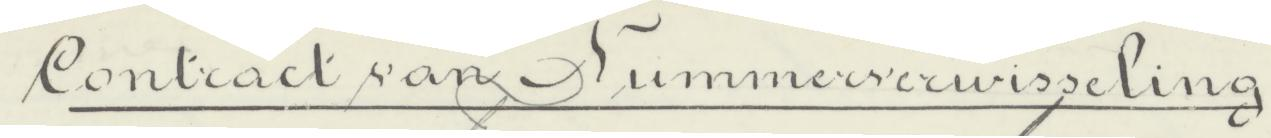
Contract van Nummerverwisseling
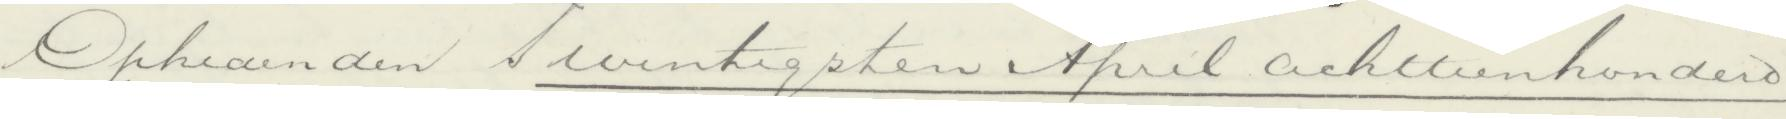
Op heden den twintigsten April achttienhonderd
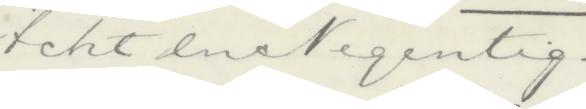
Acht en Negentig.
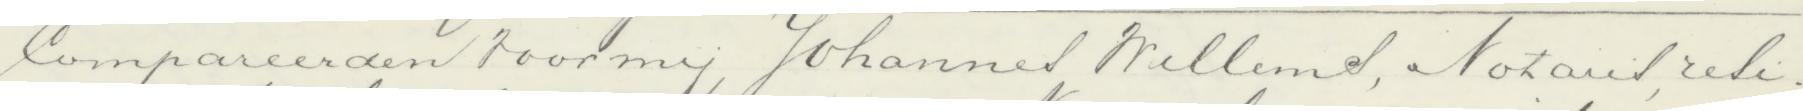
Compareerden voor mij Johannes Willems, Notaris, resi
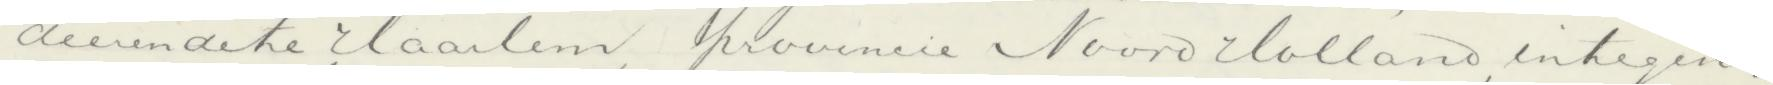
deerende te Haarlem, provincie Noord Holland, in tegen,
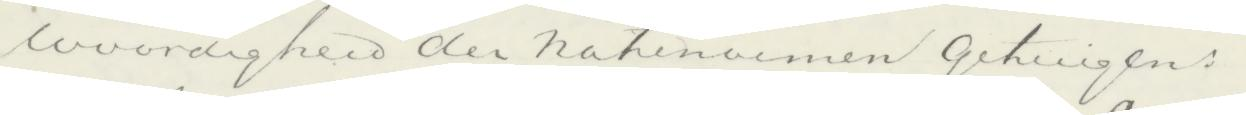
woordigheid der natenoemen getuigen.
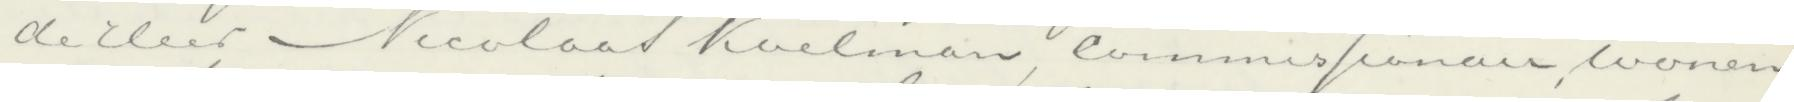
de Heer Nicolaas Koelman, commissionair, wonen
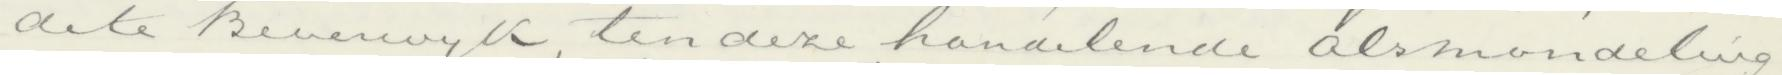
de te Beverwyk, ten deze handelende als mondeling
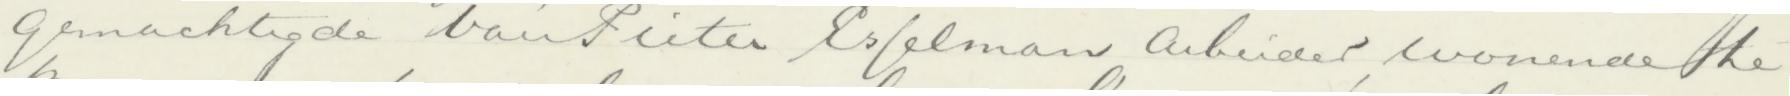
gemachtigde van Pieter Escelman Arbeider, wonende te
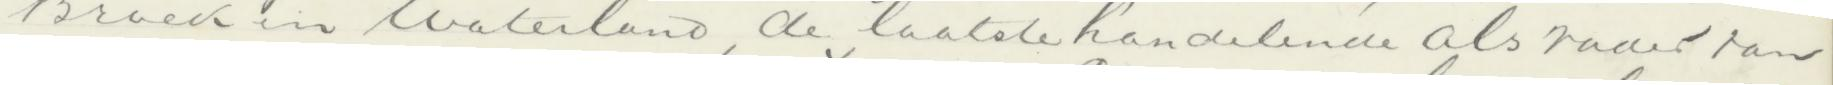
Broek in Waterland, de laatste handelende als vader van
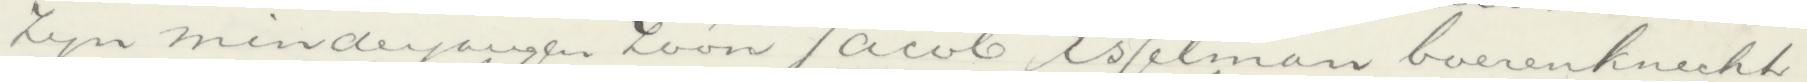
zyn minderjarigen zoon Jacob Escelman boerenkrecht
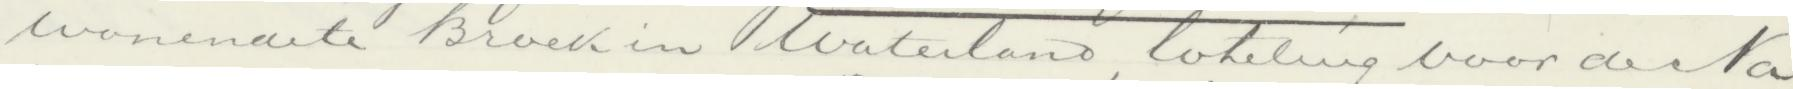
wonende te Broek in waterland loteling voor de Na
